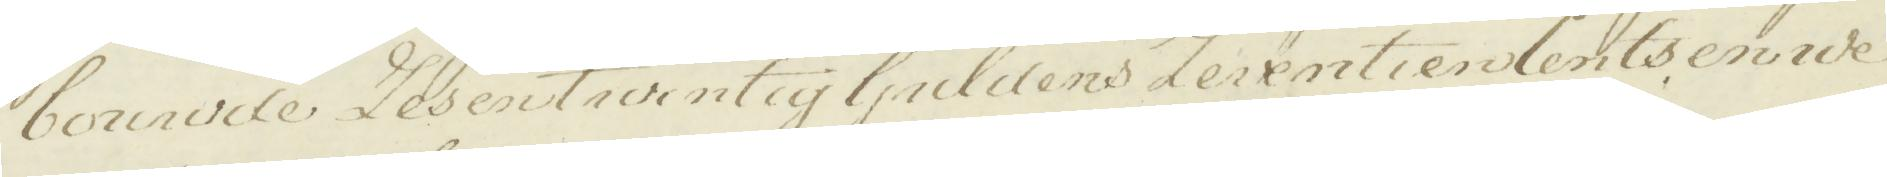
bouwde Zesentwintig Guldens Zeventien Cents, en we
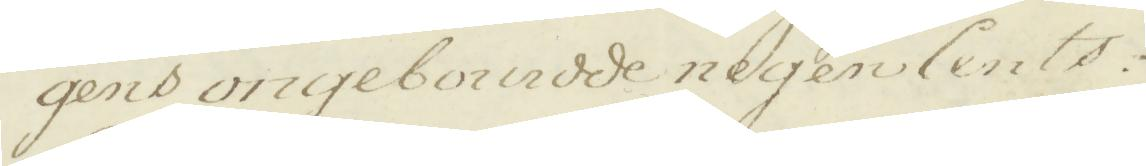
gens ongebouwde negen Cents.
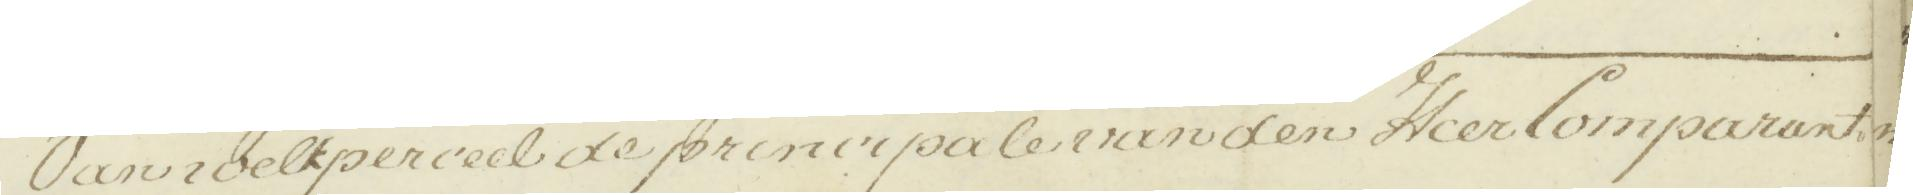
Van welk Perceel de principale van den Heer Comparant.
